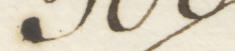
300
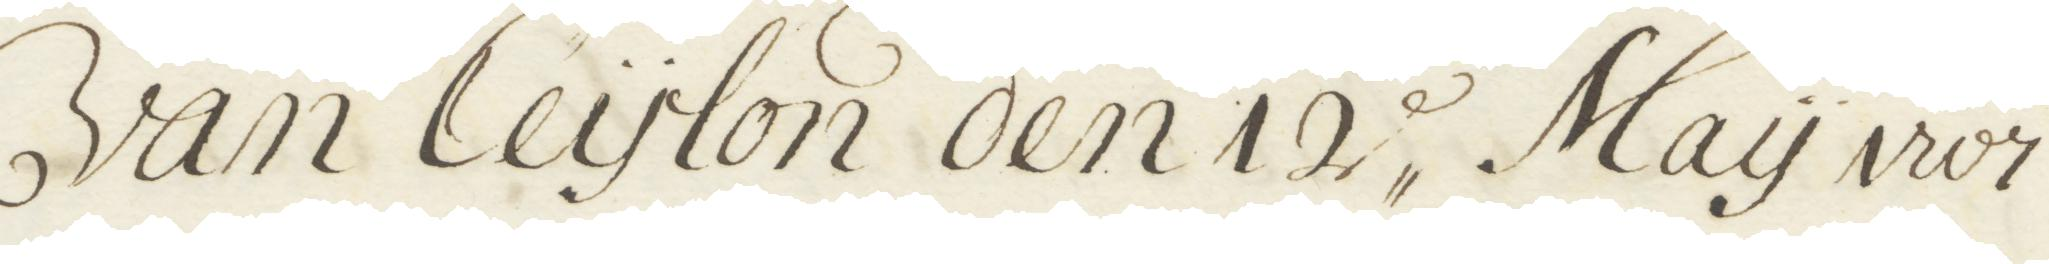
Van Ceijlon den 12„e Maij 1707
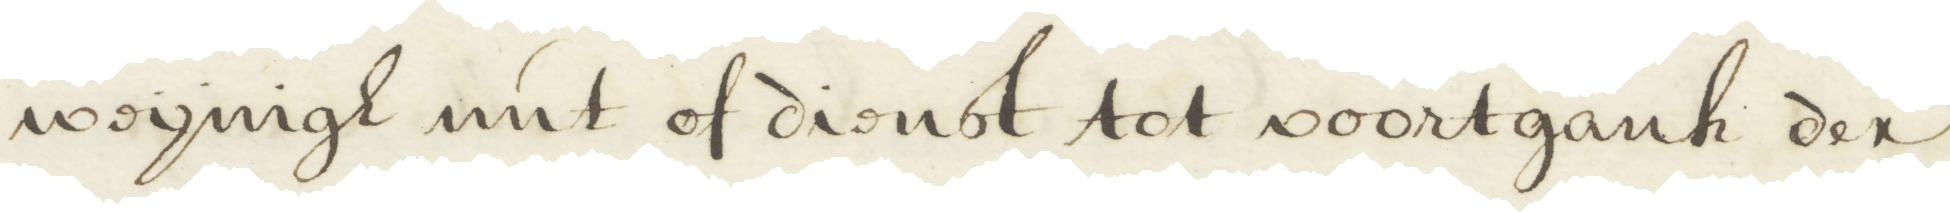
weijnigh nut of dienst tot voortgank der
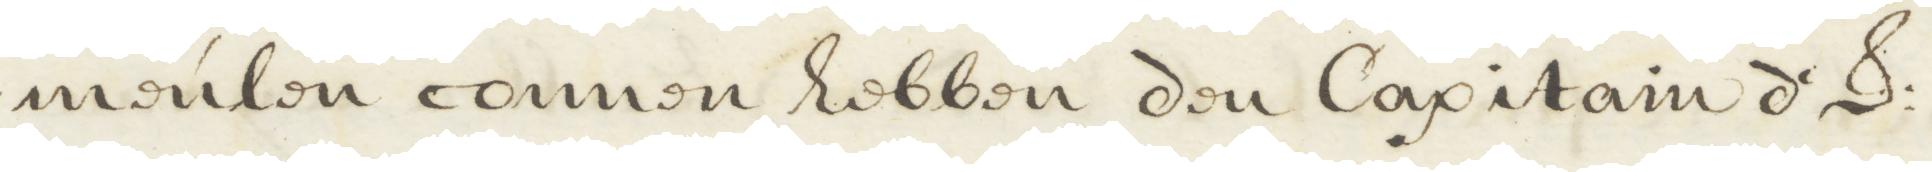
meulen connen hebben den Capitain d’ E:
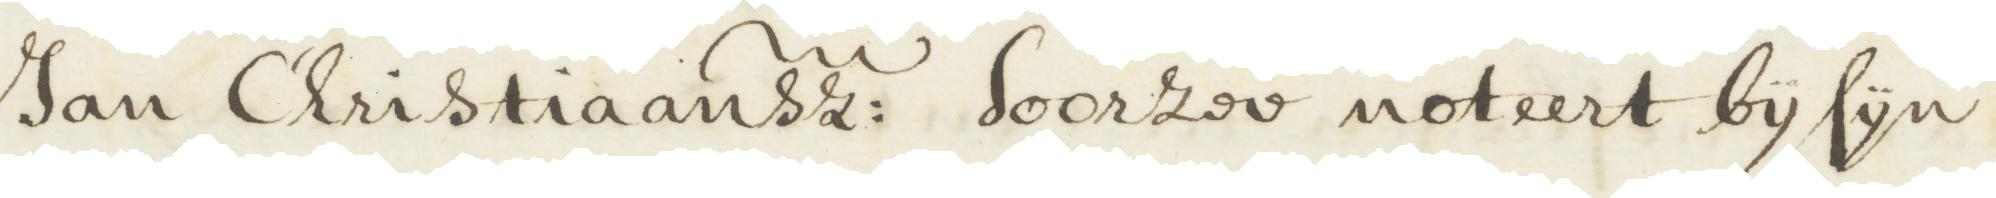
Jan Christiaansz: toorzee noteert bij sijn
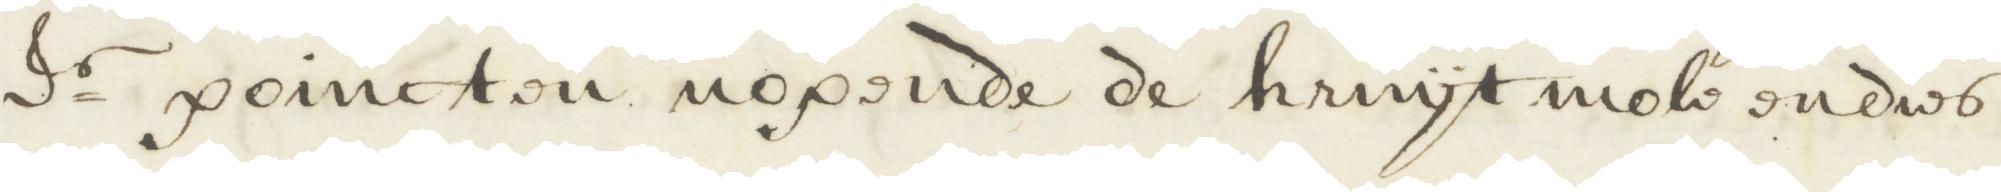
E=s poincten nopende de kruijt mole en dies
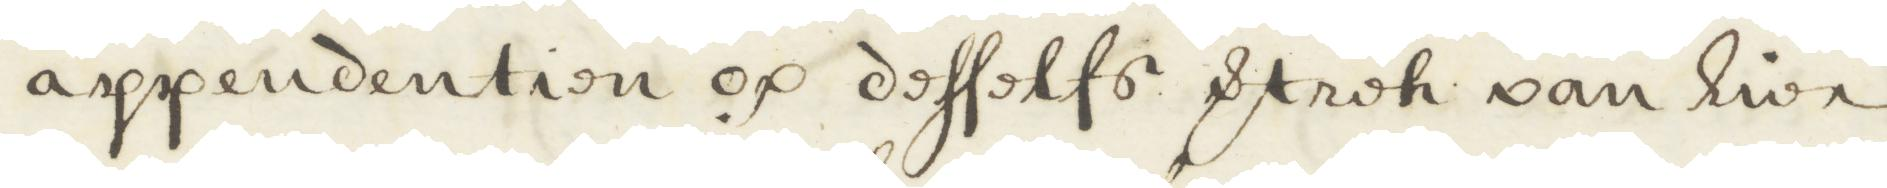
appendentien op desselfs vertrek van hier
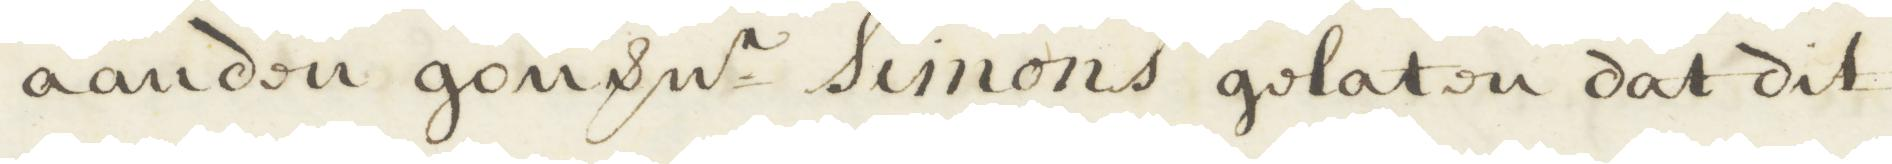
aan den gouvern=r simons gelaten dat dit
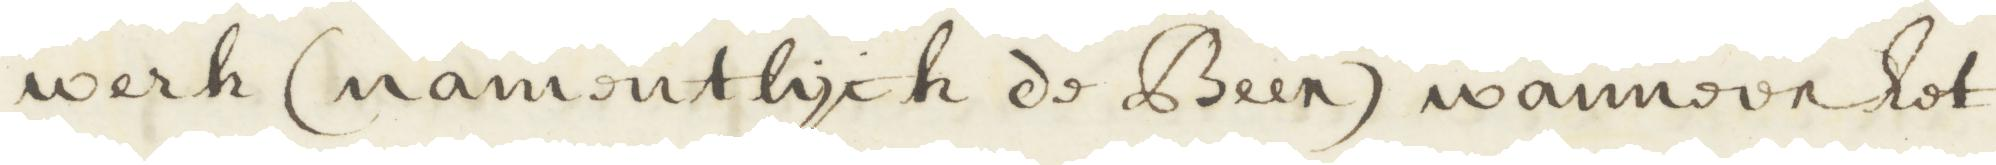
werk (namentlijck de Beer) wanneer het
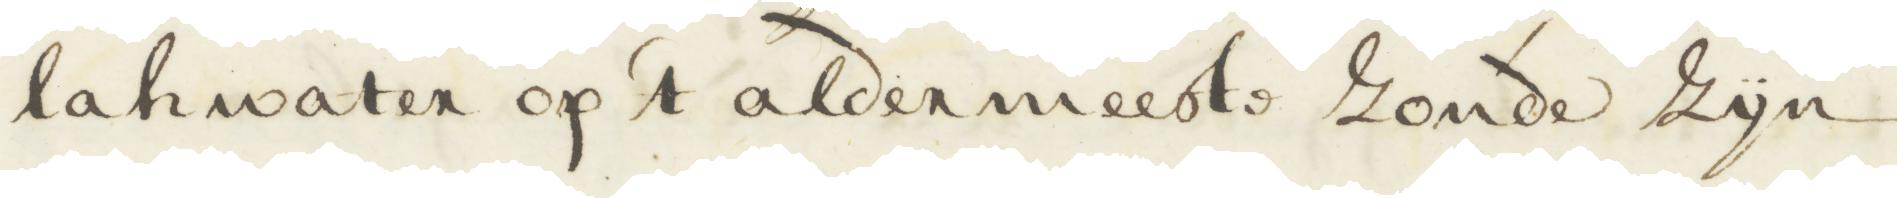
lakwater op ’t aldermeeste zoude zijn
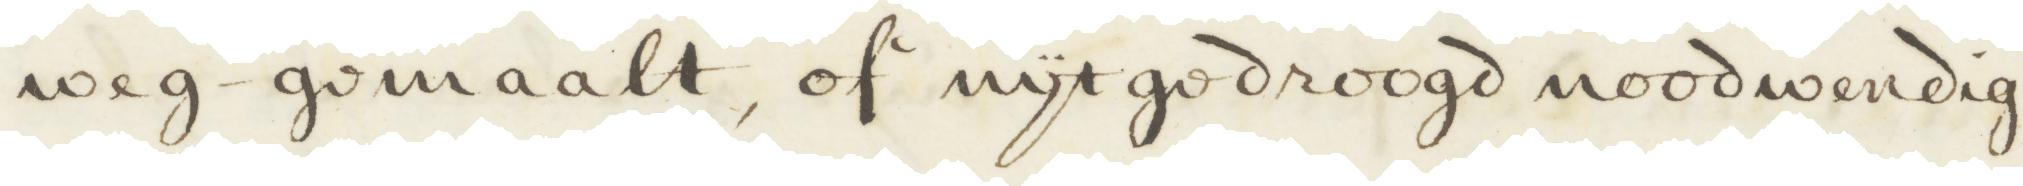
weg-gemaalt, of uijt gedroogd noodwendig
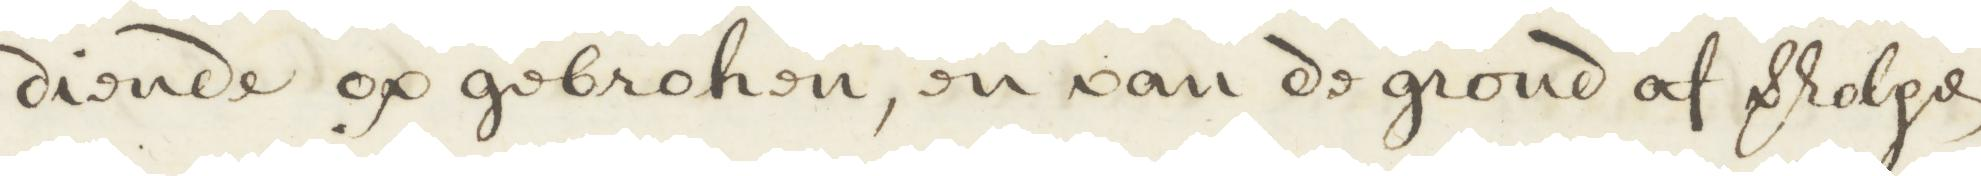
diende op gebroken, en van de grond af verholpen
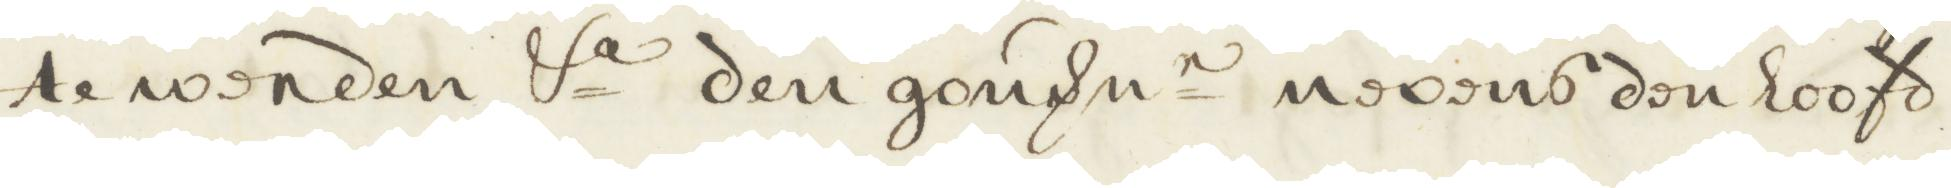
te werden &=a den gouvern=r nevens den hoofd
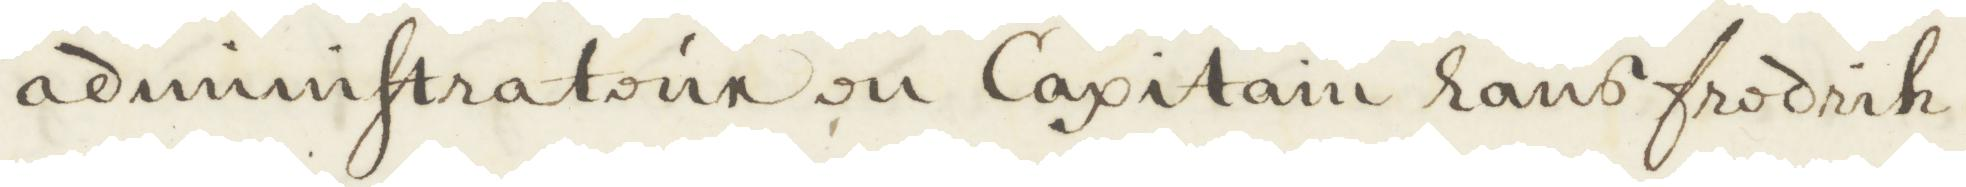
administrateur en Capitain hans fredrik
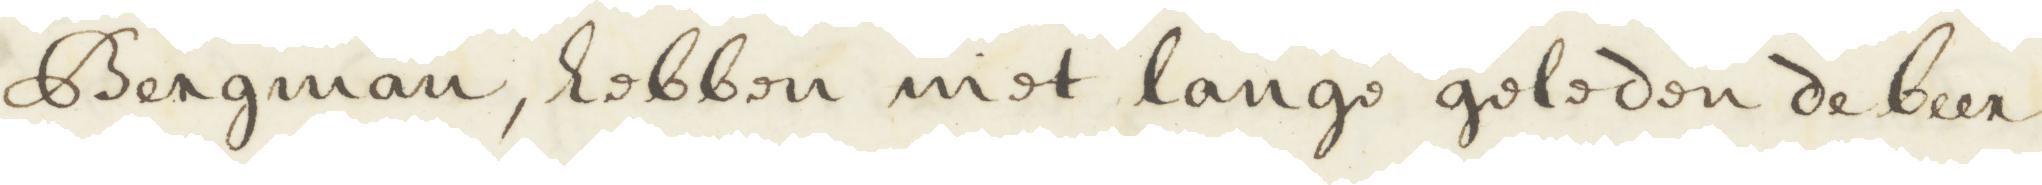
Bergman, hebben niet lange geleden de beer
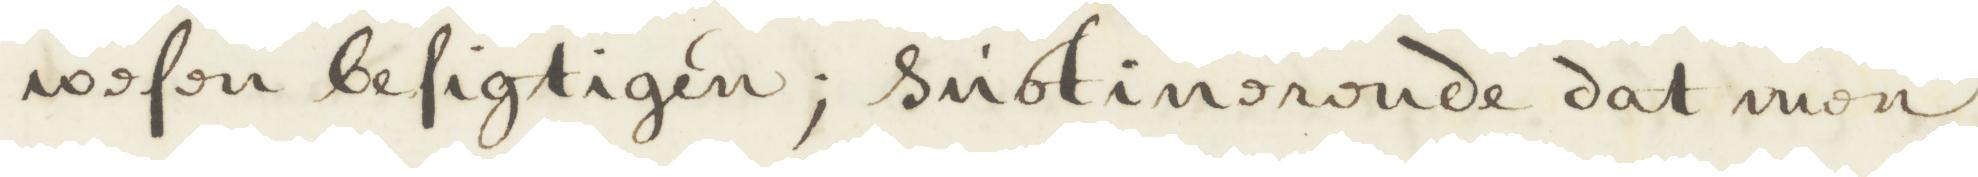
wesen besigtigen; sustinerende dat men
